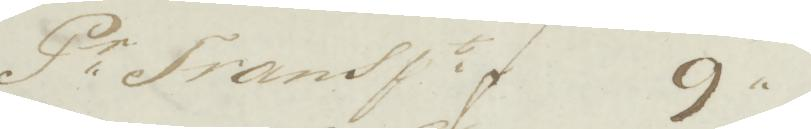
P„r Transp:t ƒ 9 „
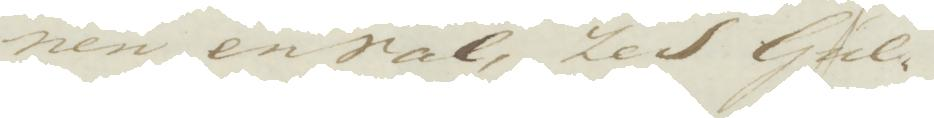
nen en val, zes Gul„
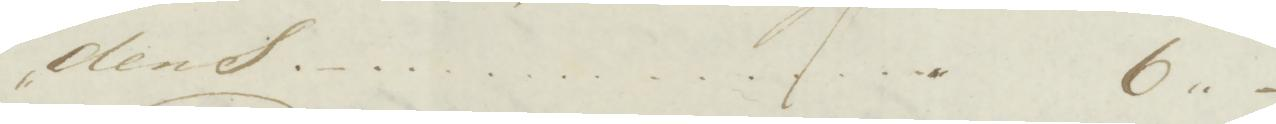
dens. „ 6 „
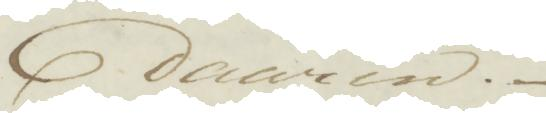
daarin.-
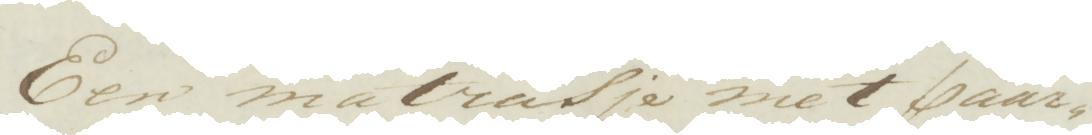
Een matrasje met paar„
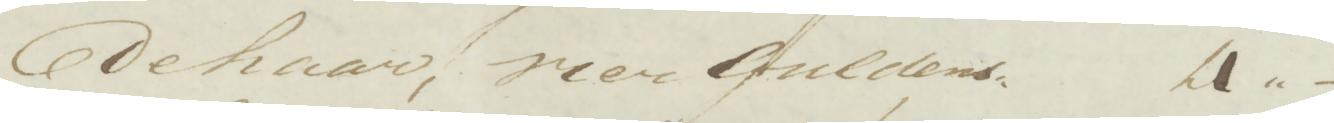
dehaar, vier Guldens. 4 „
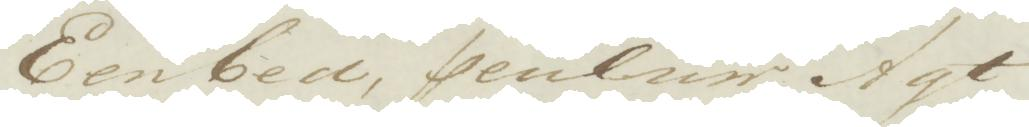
Een bed, peuluw, Agt
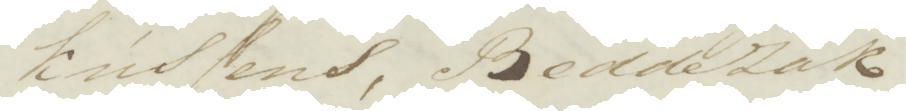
kussens, Beddezak
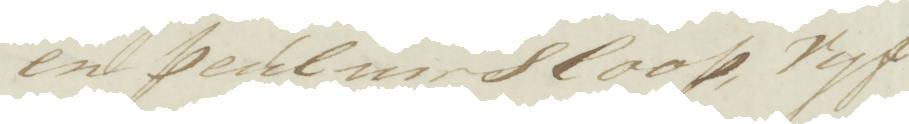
en peuluwsloop, vijf
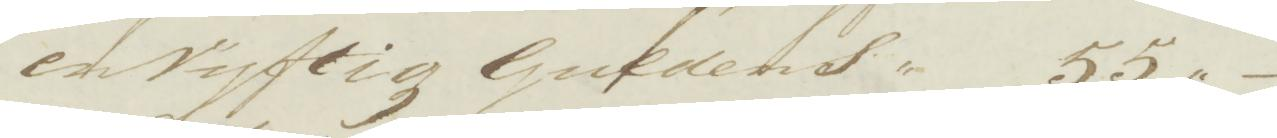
en vijftig Guldens „ 55 „-
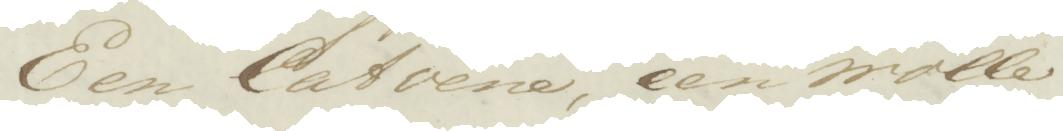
Een Catoene, een wolle
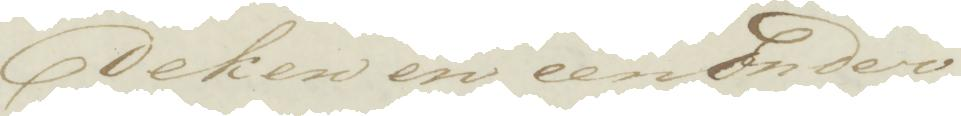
deken en een Ender
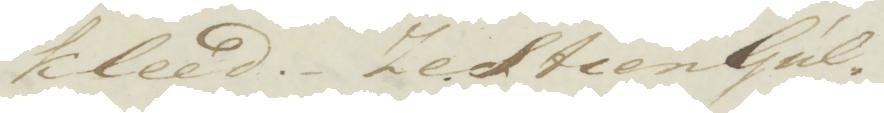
kleed.- Zestien Gul„
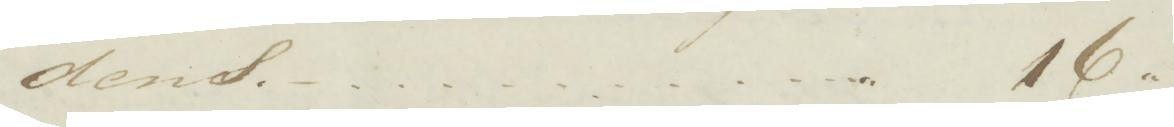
dens 16 „
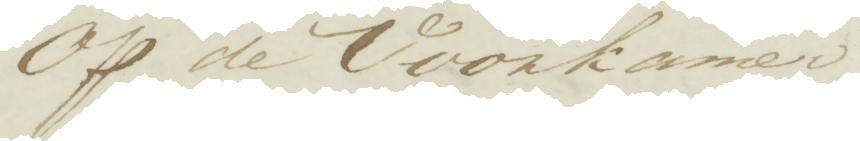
op de Voorkamer
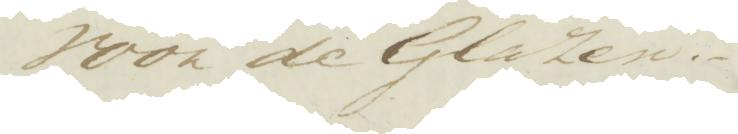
Voor de Glazen.-
